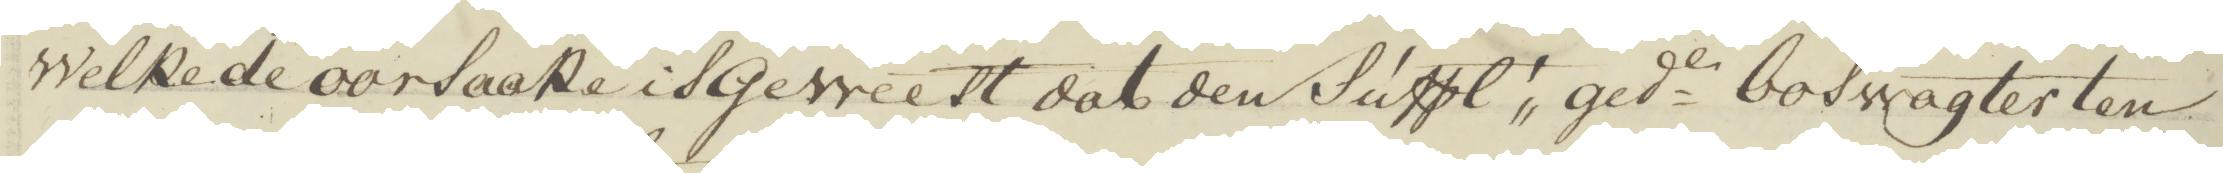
welke de oorsaake is geweest dat den suppl„t ged=e boswagter ten
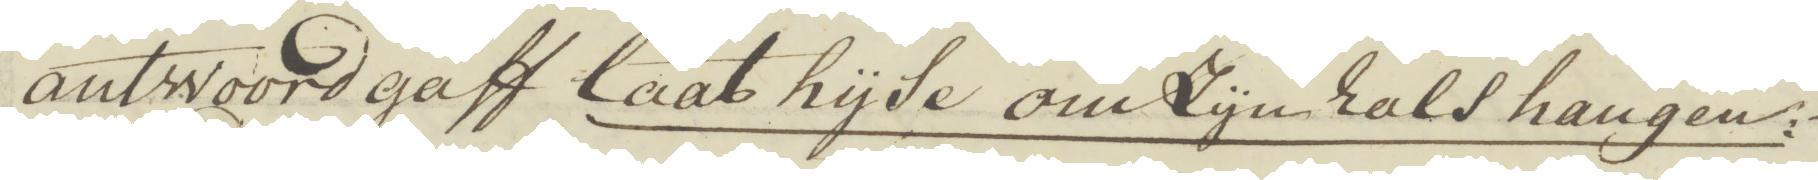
antwoord gaff laat hij se om zijn hals hangen:
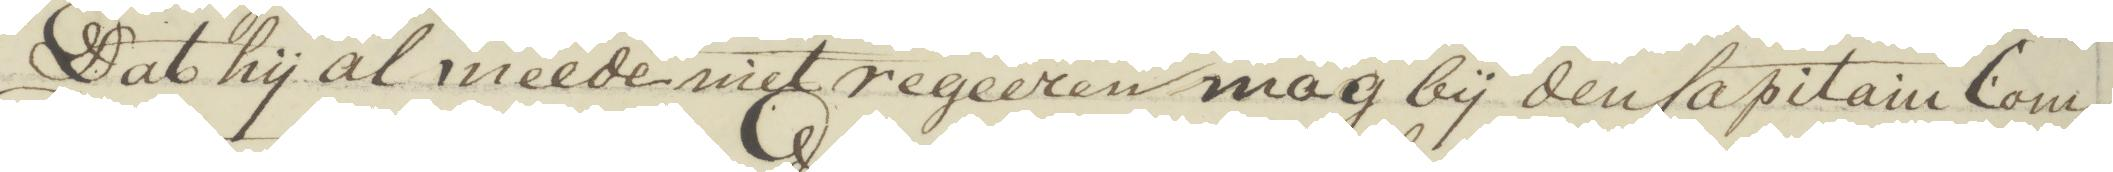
Dat hij al meede niet regeeren mag bij den Capitain Com
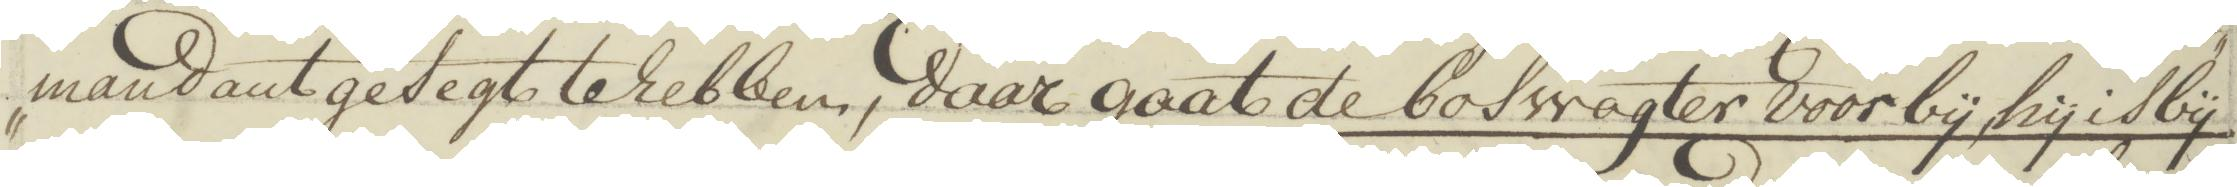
„mandant gesegt te hebben, daar gaat de boswagter voor bij, hij is bij
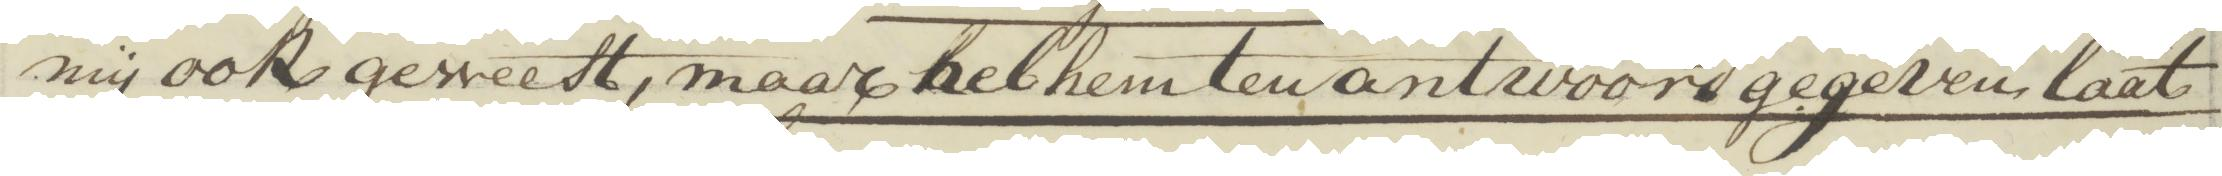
mij ook geweest, maar heb hem ten antwoord gegeven laat
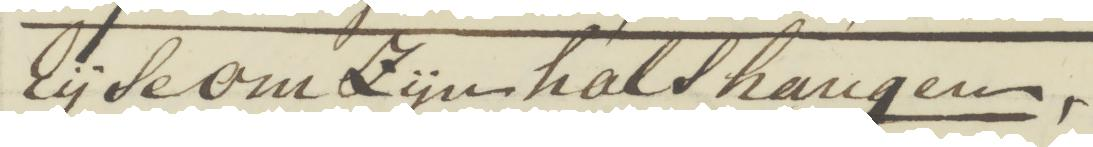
hijse om Zijn hals hangen,
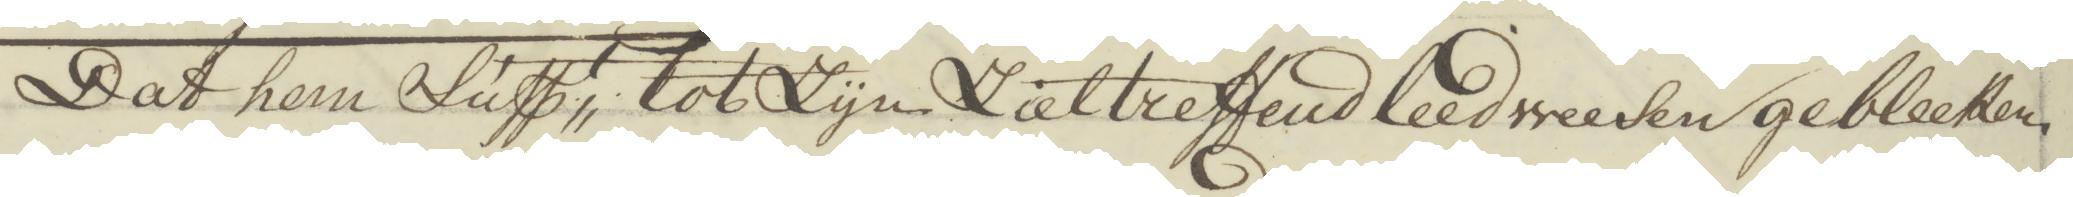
Dat hem supp„t tot zijn ziel treffend leed weesen gebleeken
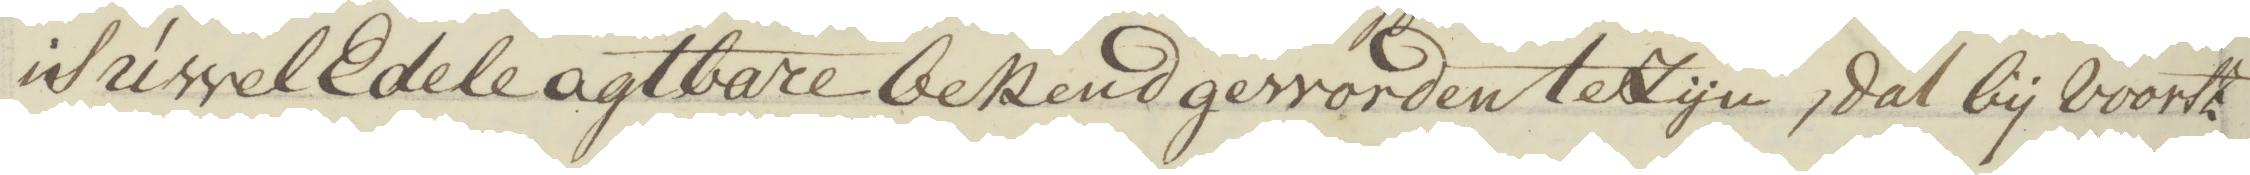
is uwel Edele agtbare bekend geworden tezijn, dat bij voorsz:
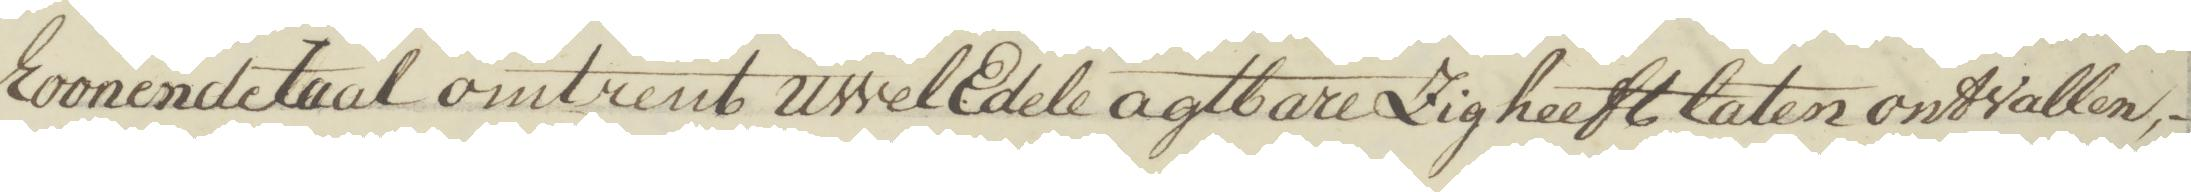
hoonendetaal omtrent uwel Edele agtbare Zig heeft laten ontvallen,-
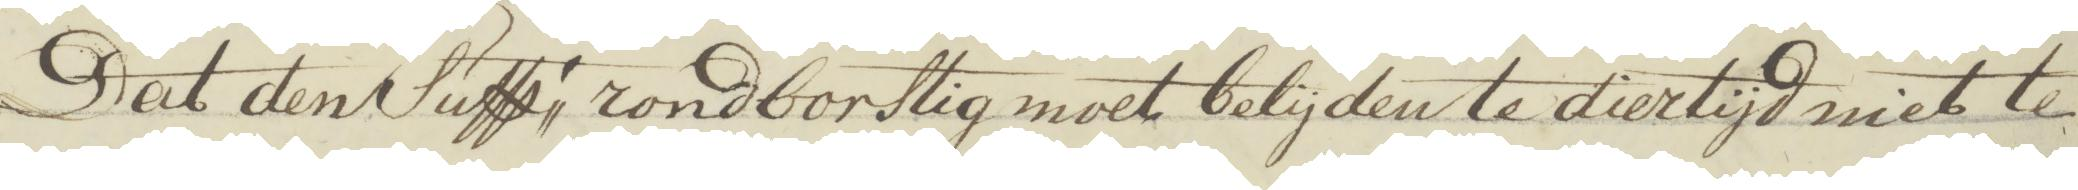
Dat den supp„t rondborstig moet belijden te dier tijd niet te
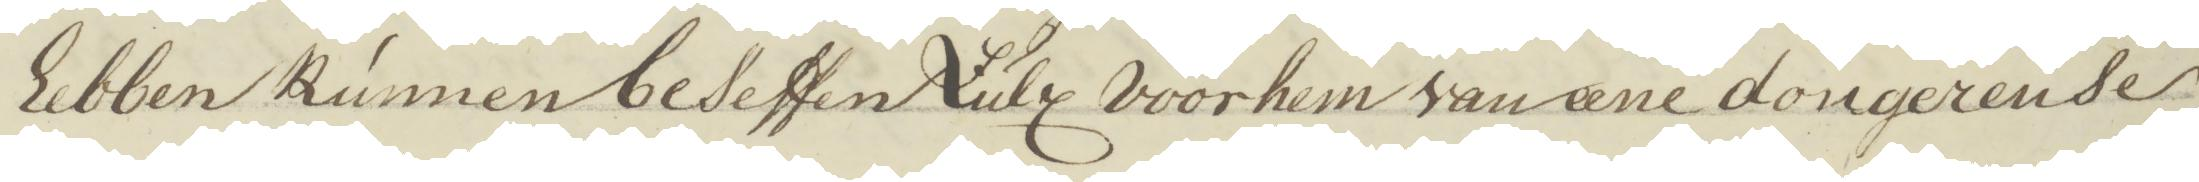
hebben kunnen beseffen Zulx voor hem van eene dongereuse
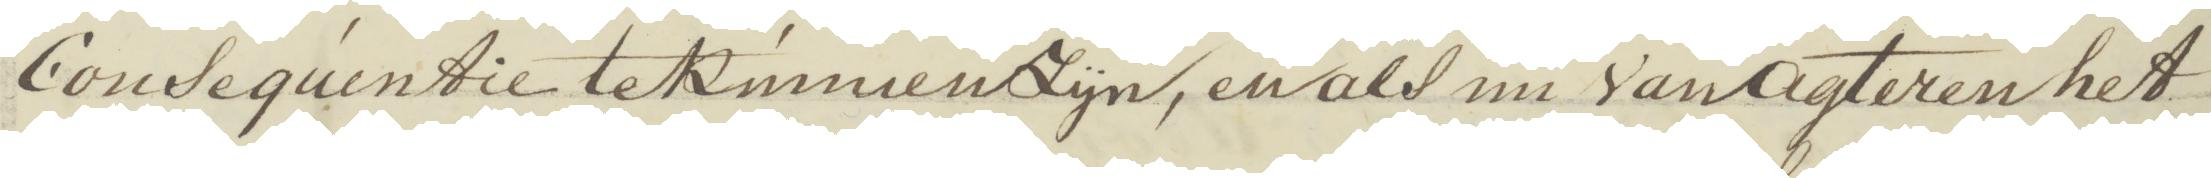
Consequentie te kunnenzijn, en als nu vanagteren het
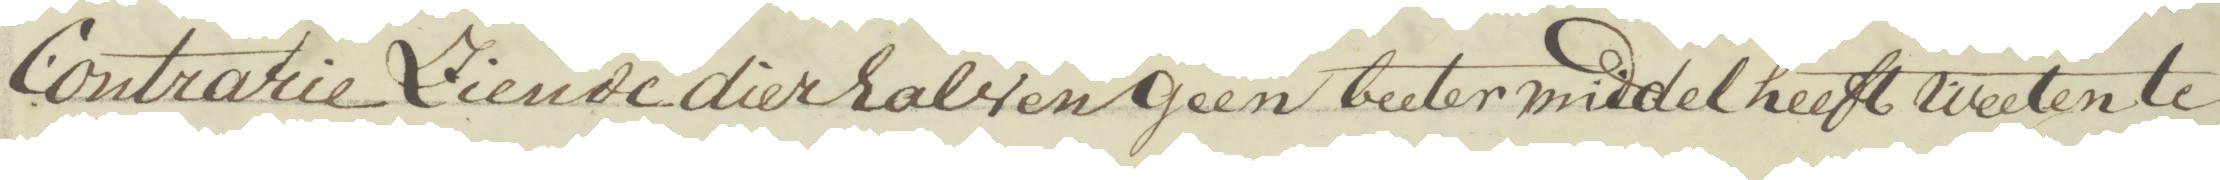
Contrarie Ziende dierhalven geen beeter middel heeft weeten te
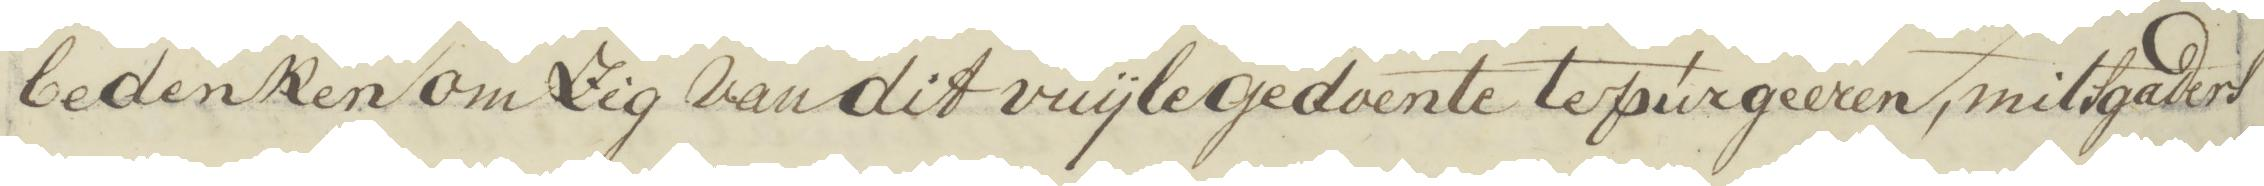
bedenken om Zig van dit vuijle gedoente te purgeeren, mitsgaders
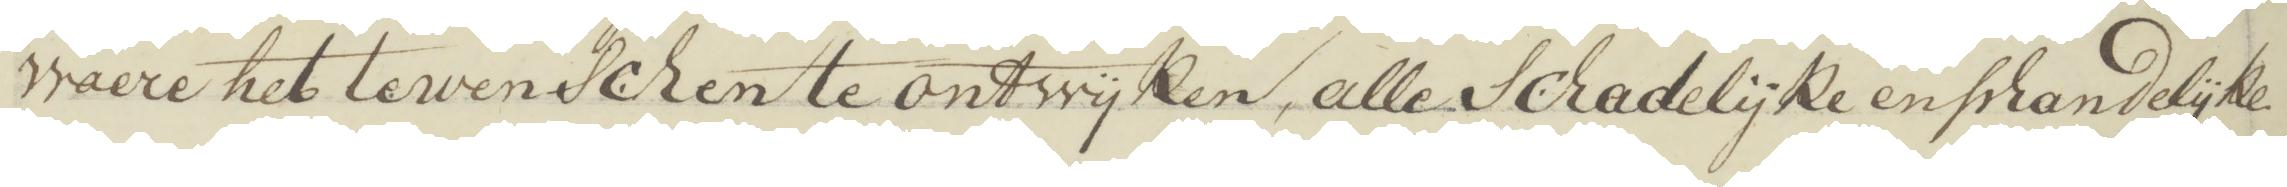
waere het tewenschen te ontwijken, alle schadelijke en schandelijke
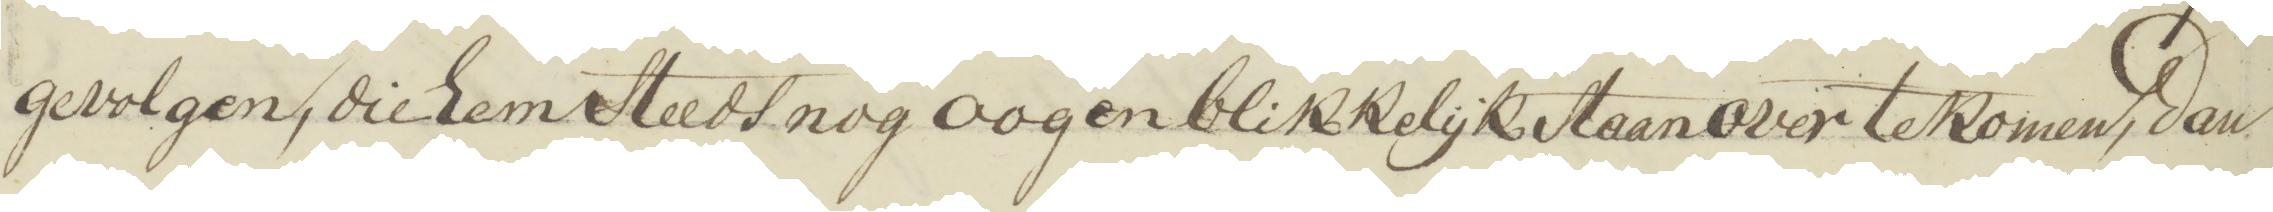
gevolgen, die hem steeds nog oogen blikkelijk staan over te komen, dan
